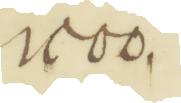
1500.
